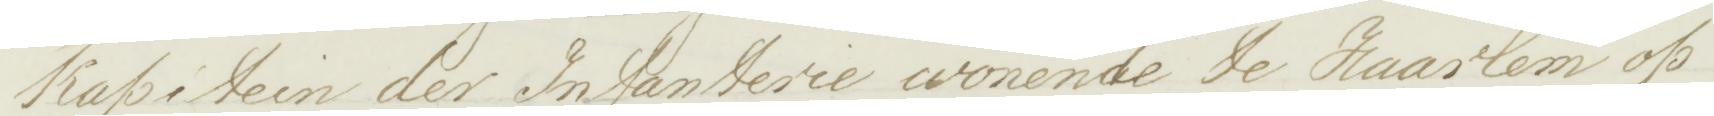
Kapitein der Infanterie wonende te Haarlem op
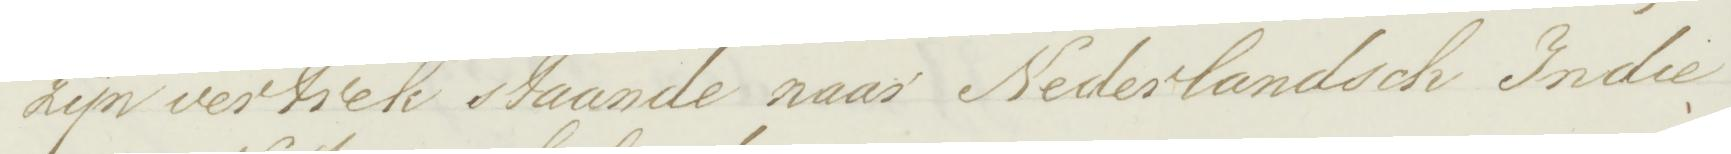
zijn vertrek staande naar Nederlandsch Indie
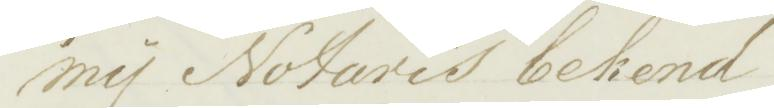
mij Notaris bekend
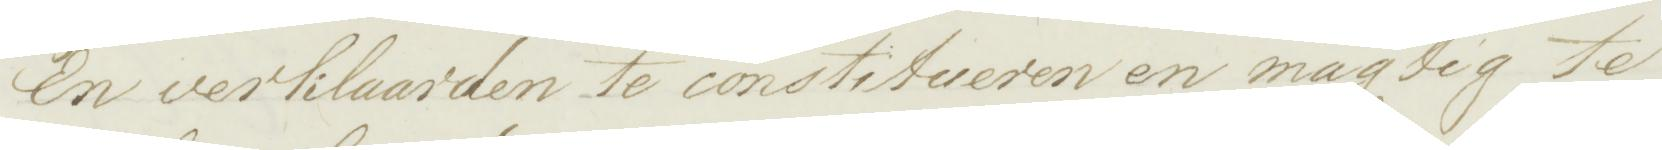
En verklaarden te constitueren en magtig te
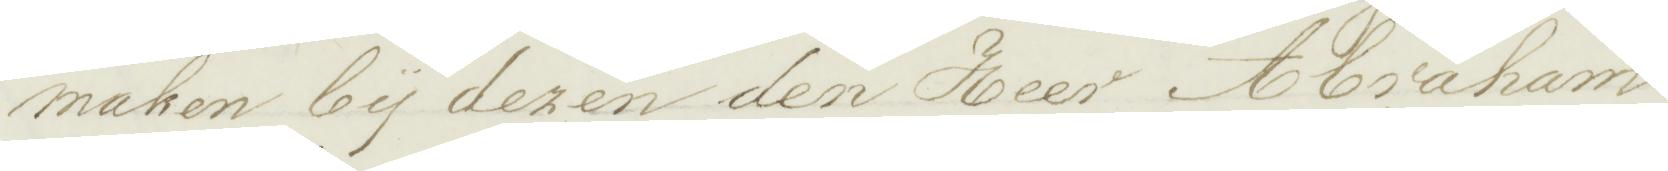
maken bij dezen den Heer Abraham
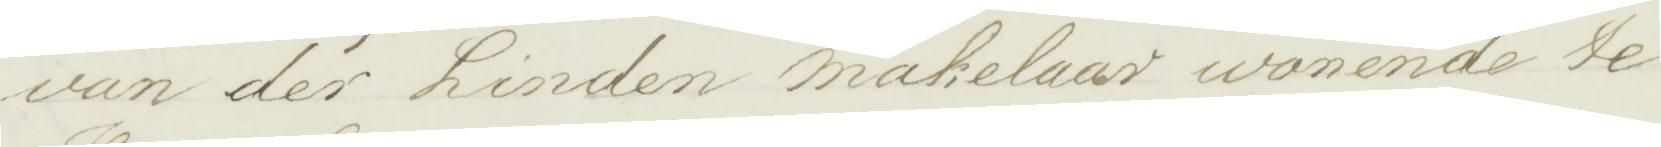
van der Linden makelaar wonende te
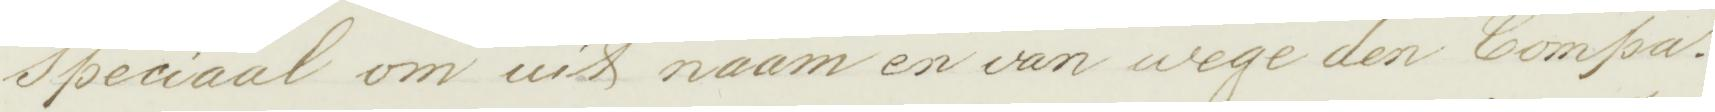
speciaal om uit naam en van wege den Compa„
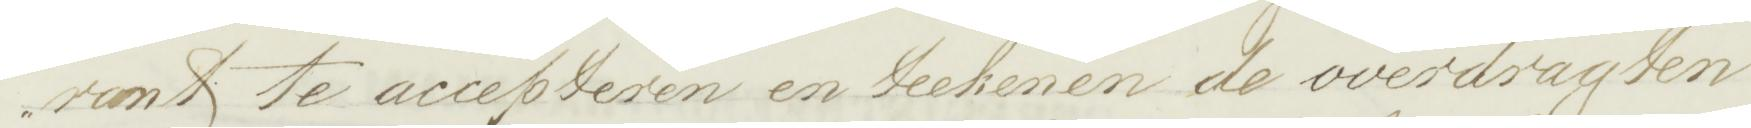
„rant te accepteren en teekenen de overdragten
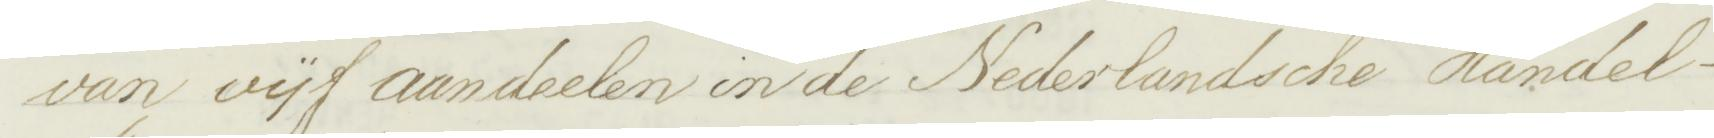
van vijf aandeelen in de Nederlandsche Handel-
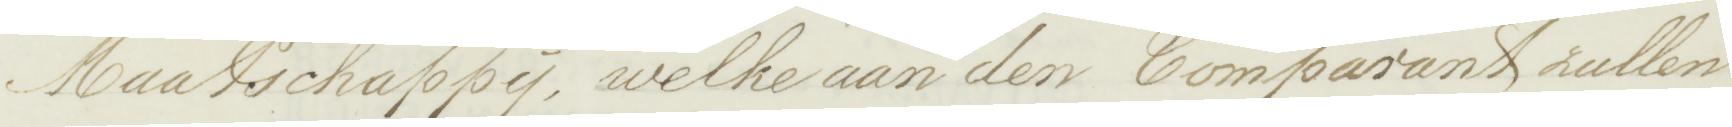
Maatschappij, welke aan den Comparant zullen
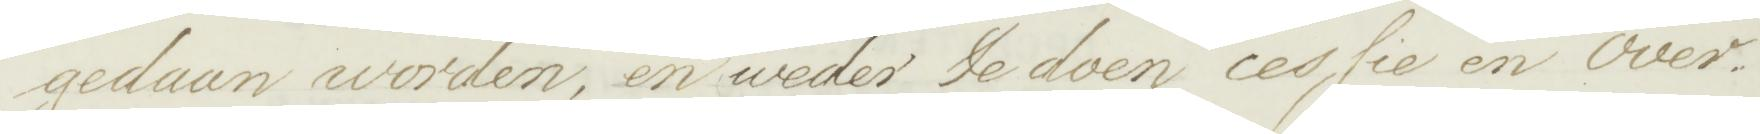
gedaan worden, en weder te doen cessie en over„
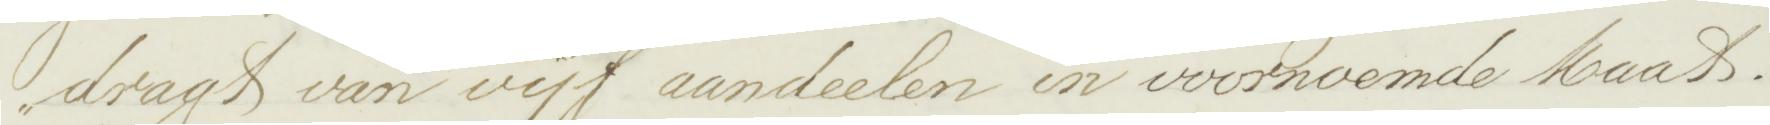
„dragt van vijf aandeelen in voornoemde Maat,
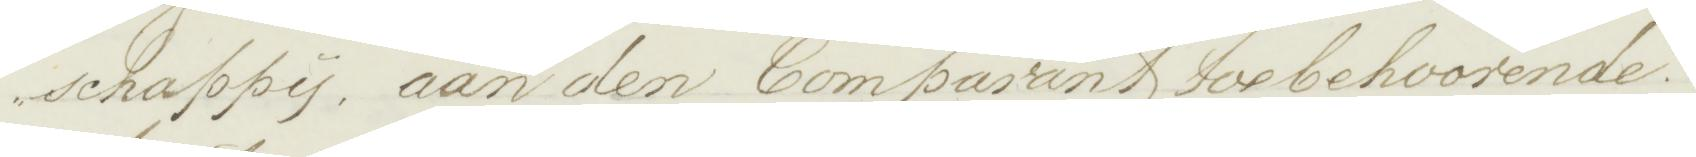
„schappij, aan den Comparant toebehoorende.
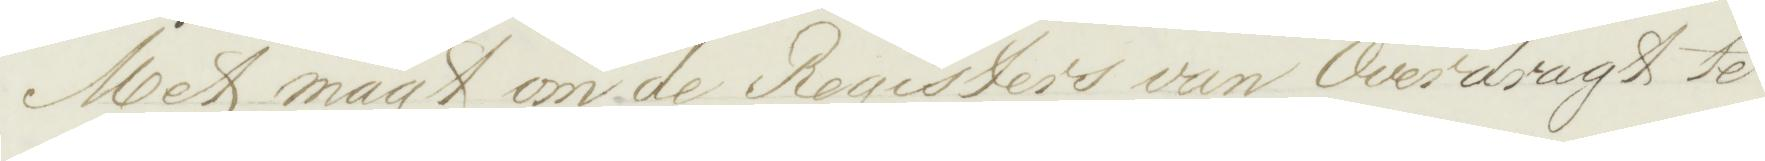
Met magt om de Registers van Overdragt te
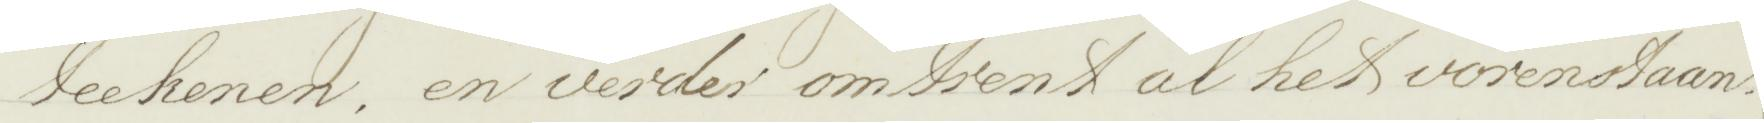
teekenen, en verder omtrent al het vorenstaan,
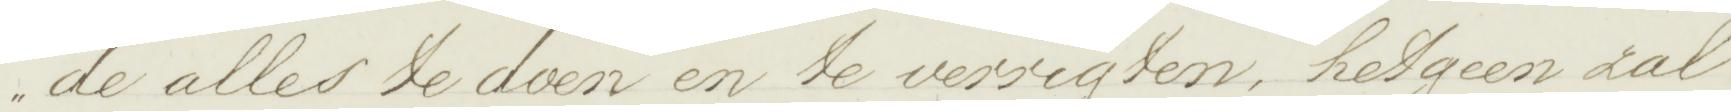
„de alles te doen en te verrigten, hetgeen zal
